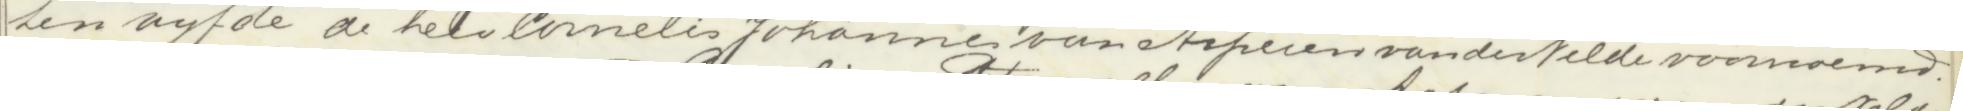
ten vyfde de heer Cornelis Johannes van Asperen van der Velde voornoemd.
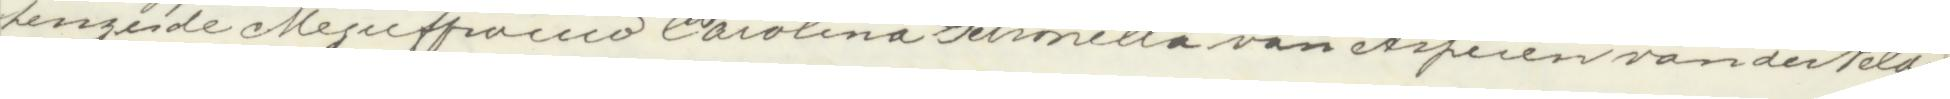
ten zesde Mejuffrouuw Carolina Petronella van Asperen van der Velde
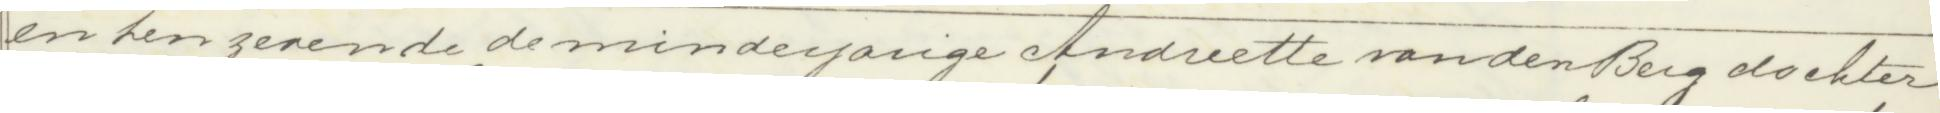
en ten zevende de minderjarige Andreette van den Berg dochter
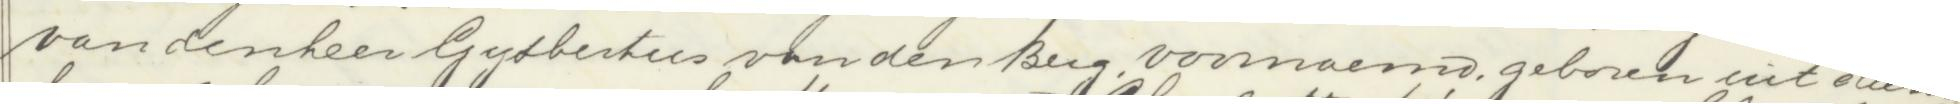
van den heer Gysbertus van den Berg, voornoemd, geboren uit diens
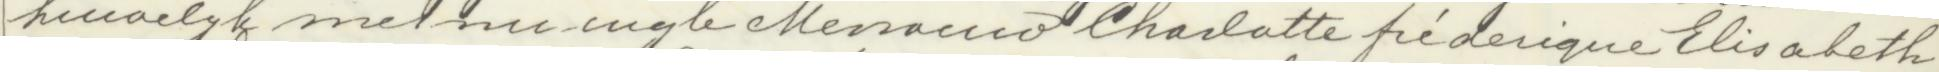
huwelyk met nu wyle Mevrouw Charlotte fréderique Elisabeth
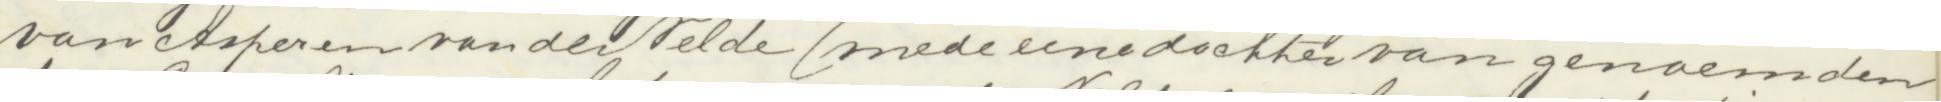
van Asperen van der Velde mede eene dochter van genoemden
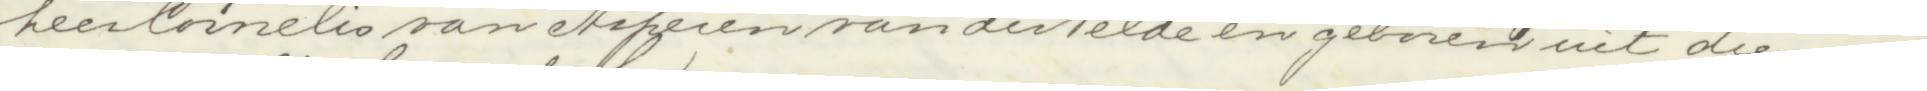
heer Cornelis van Asperen van der Velde en geboren uit diens
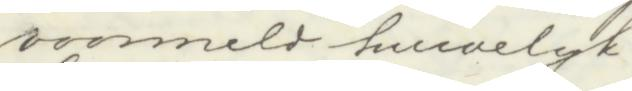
voormeld huwelyk
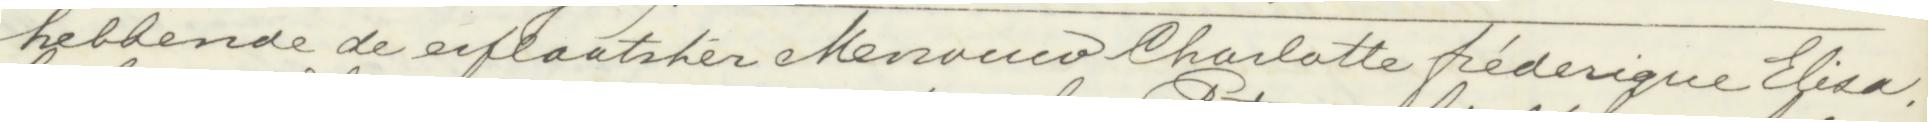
hebbende de erflaatster Mevrouw Charlotte fréderique Elisa,
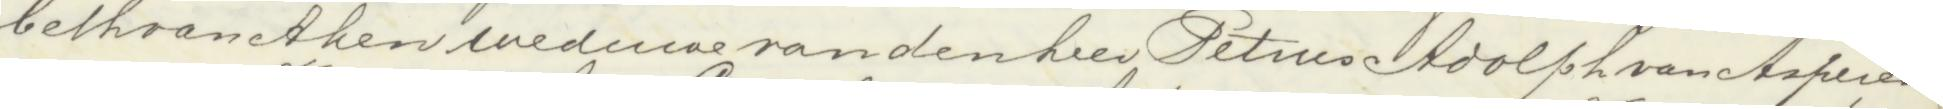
beth van Aken weduwe van den heer Petrus Adolph van Asperen
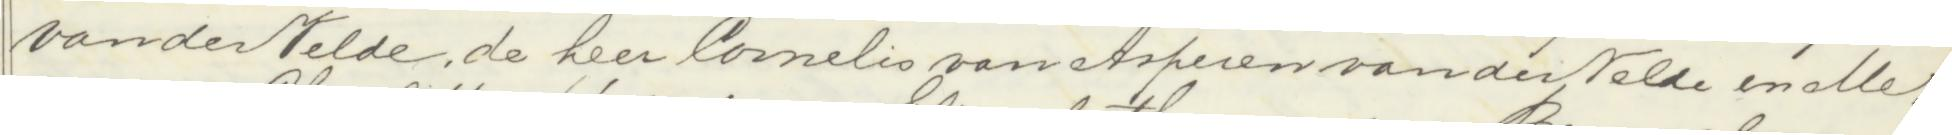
van der Velde, de heer Cornelis van Asperen van der Velde en Me
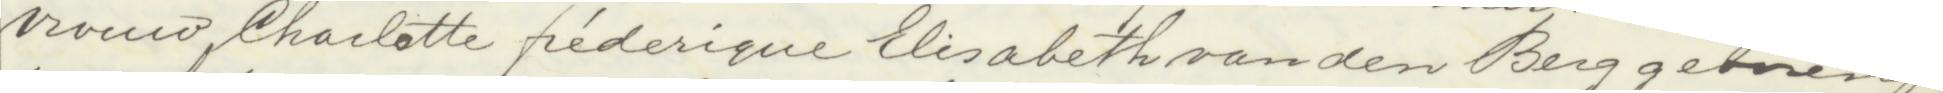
vrouw Charlotte fréderique Elisabeth van den Berg geboren
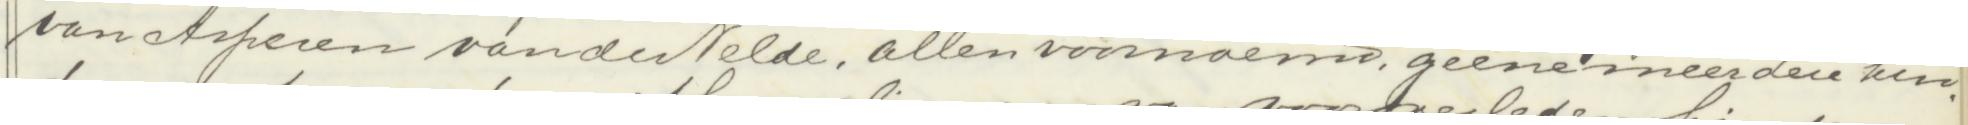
van Asperen van der Velde, allen voornoemd, geene meerdere kin„
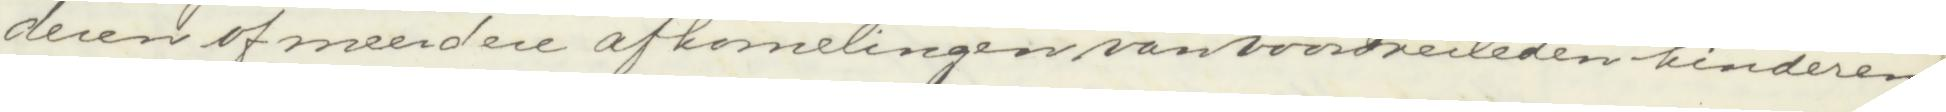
deren of meerdere afkomelingen van vooroverleden kinderen
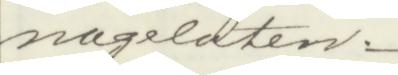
nagelaten.-
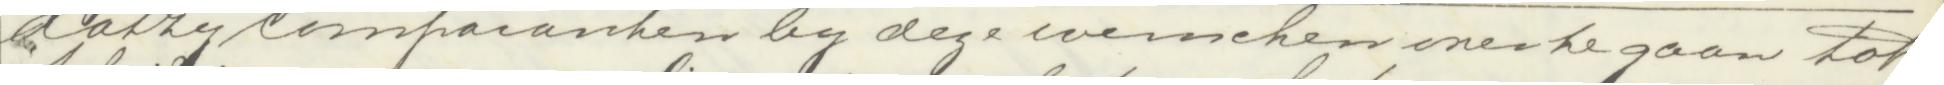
Dat zy Comparanten by deze wenschen over te gaan tot
